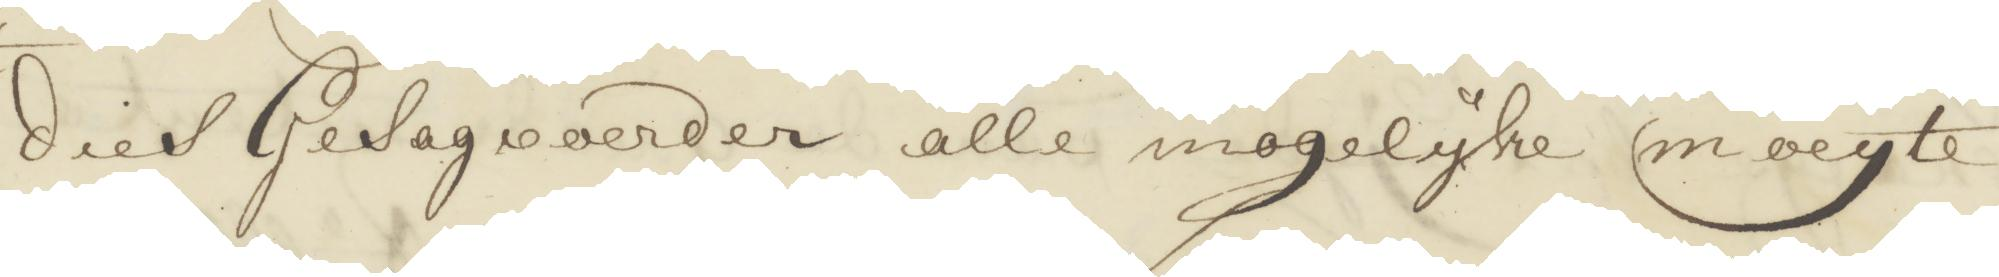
dies Gesagvoerder alle mogelijke moeijte
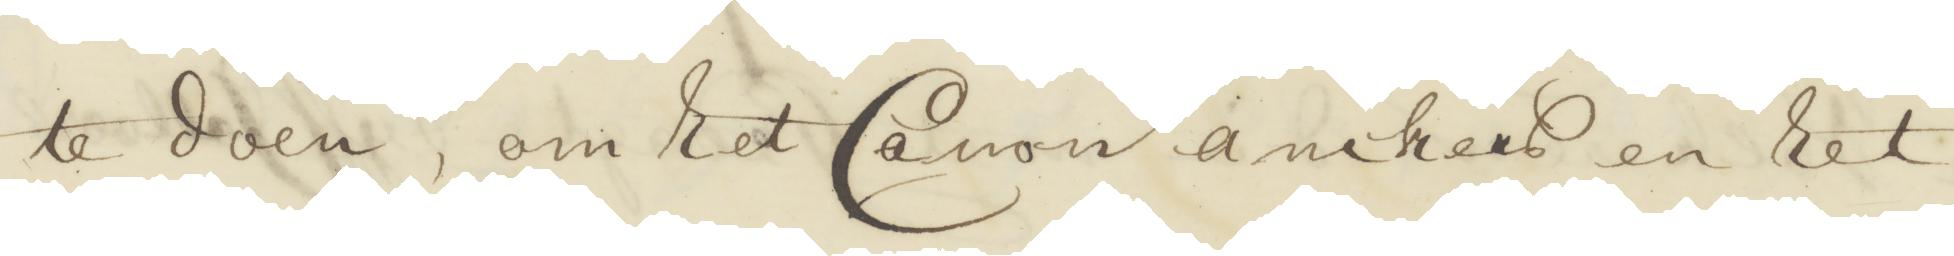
te doen, om het Canon anckers en het
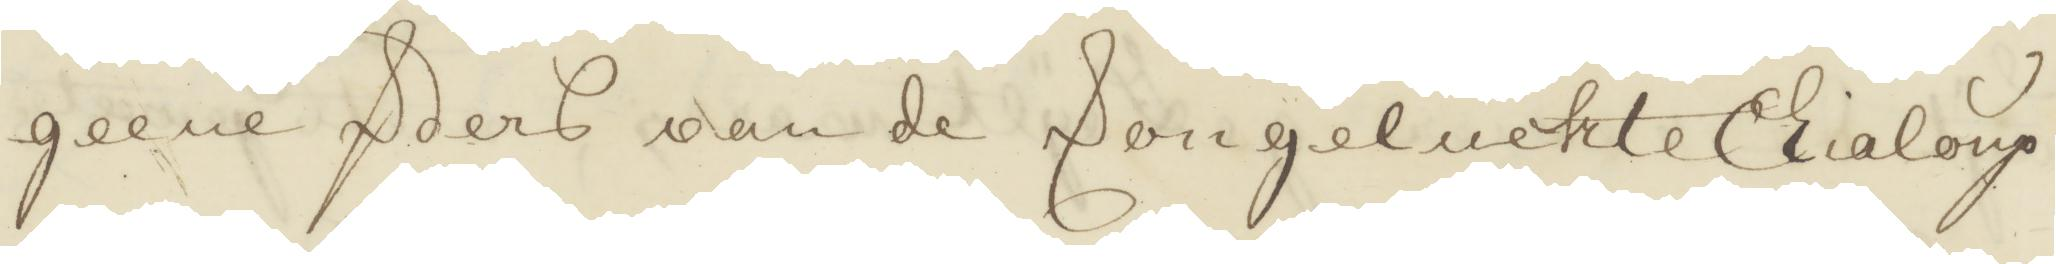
geene verders van de verongeluckte Chialoup
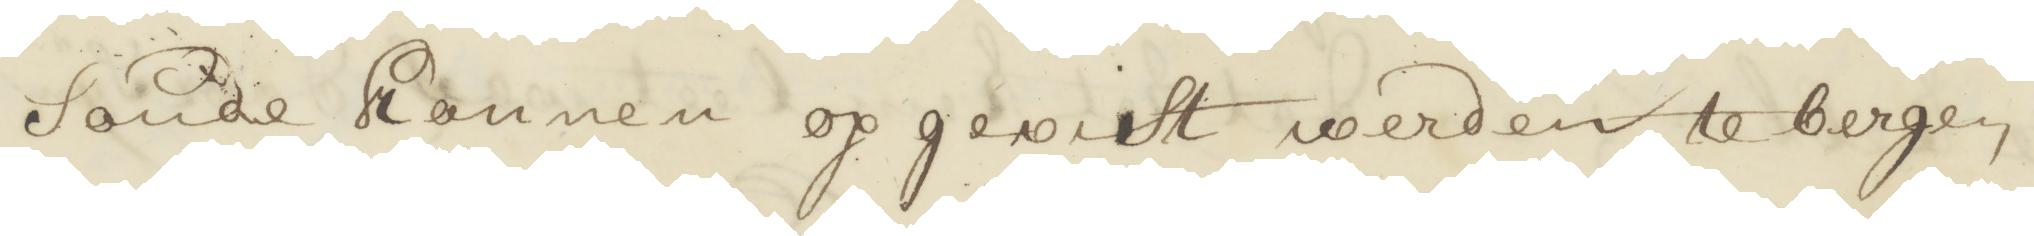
soude konnen op gevist werden, te bergen
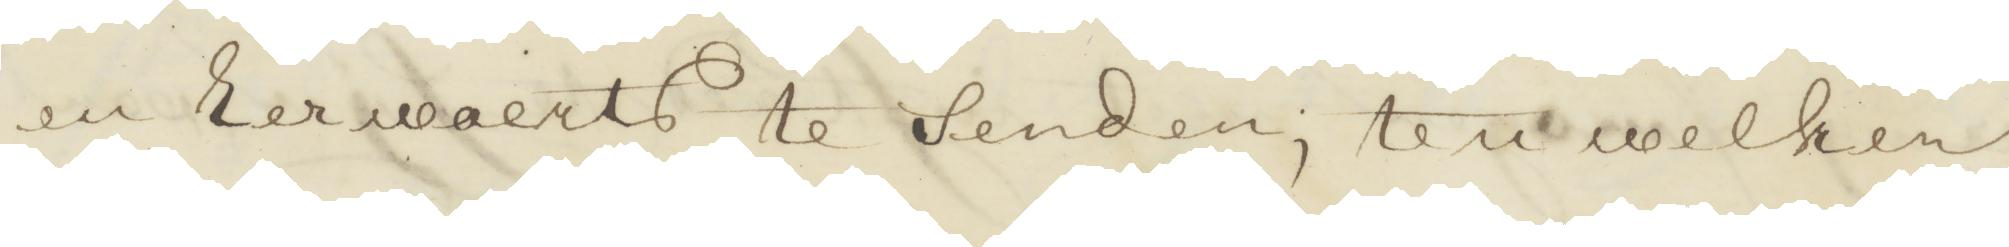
en herwaerts te senden; ten welken
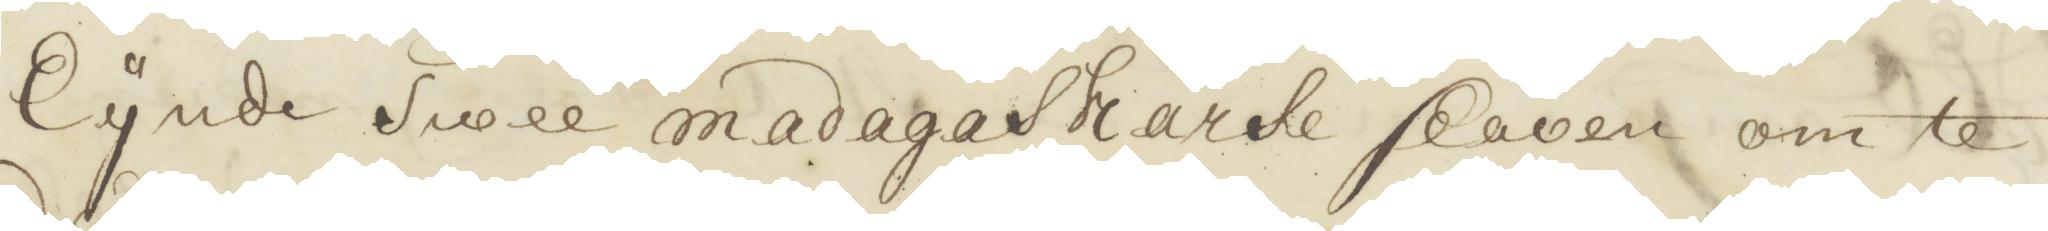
Eijnde Twee madagaskarse slaven om te
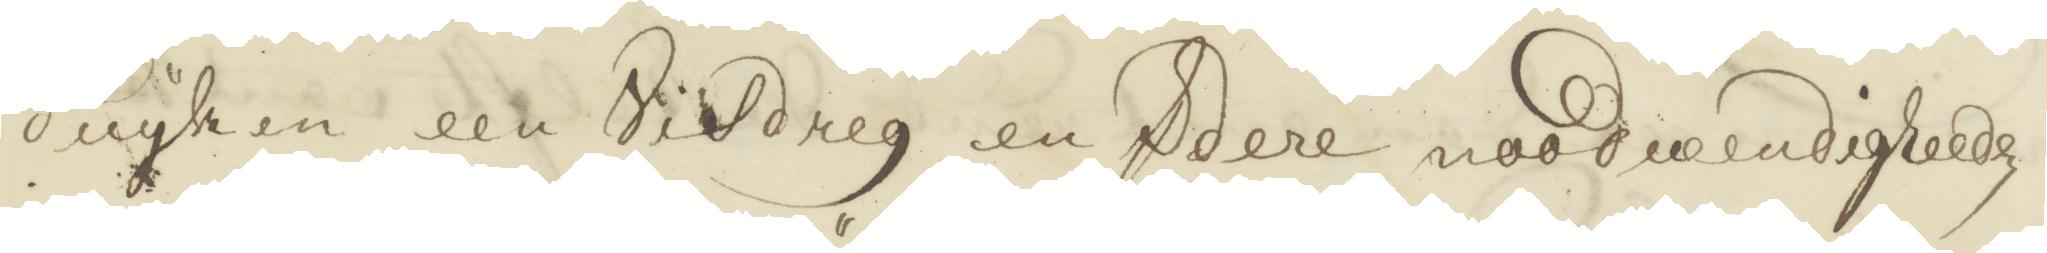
duijken een Visdreg en verdere noodwendigheeden
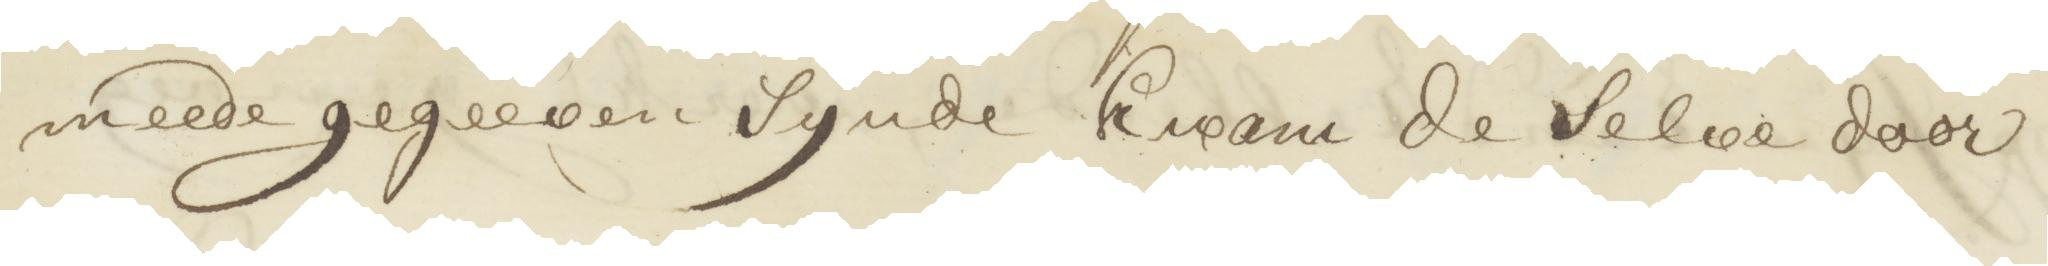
meede gegeeven sijnde kwam de selve door
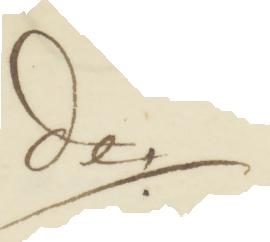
de._
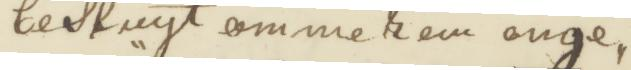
besluijt omme hem onge„
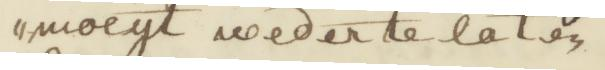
„moeijt weder te laten
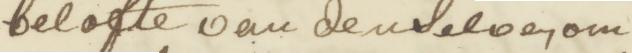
belofte van denselven om
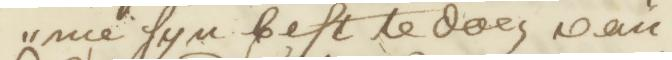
„me sijn best te doen van
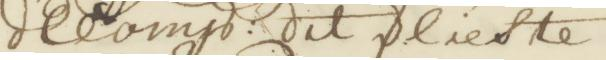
d'E Comp: dit verlies te
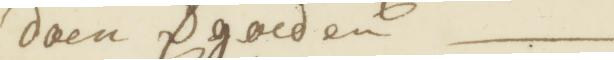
doen vergoeden _
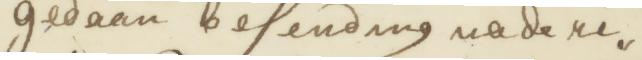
gedaan besending nade ri„
